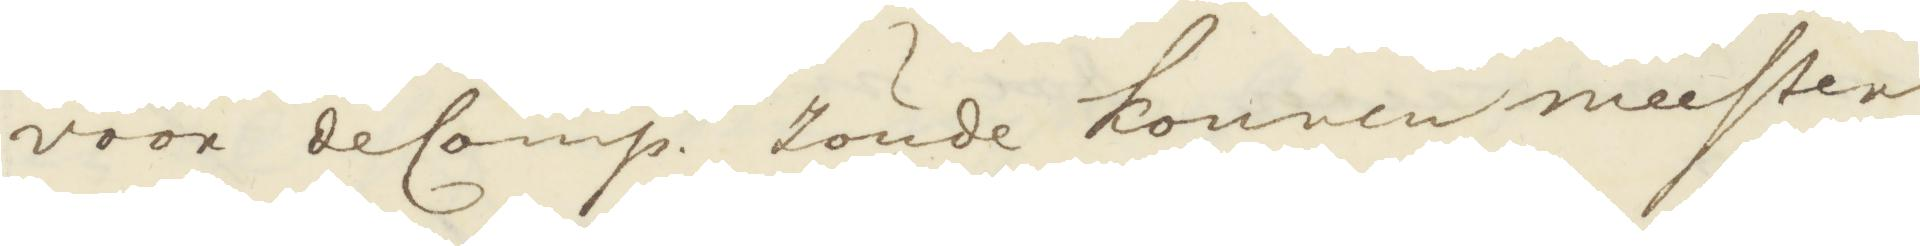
voor de Comp. zoude konnen meester
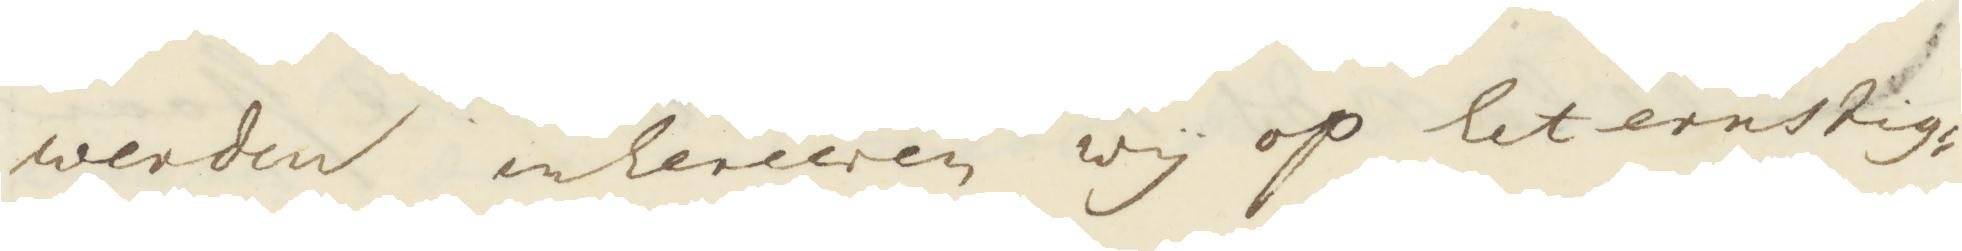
werden inhereeren wij op het ernstig„
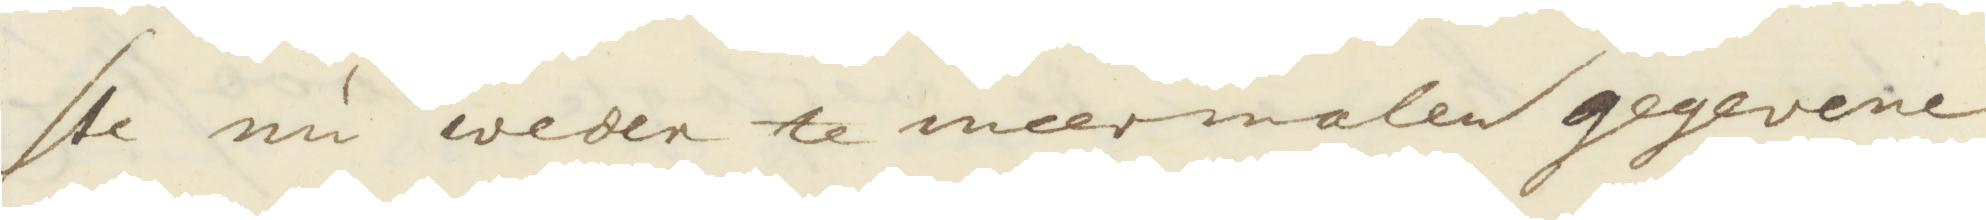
ste nu weder te meermalen gegevene
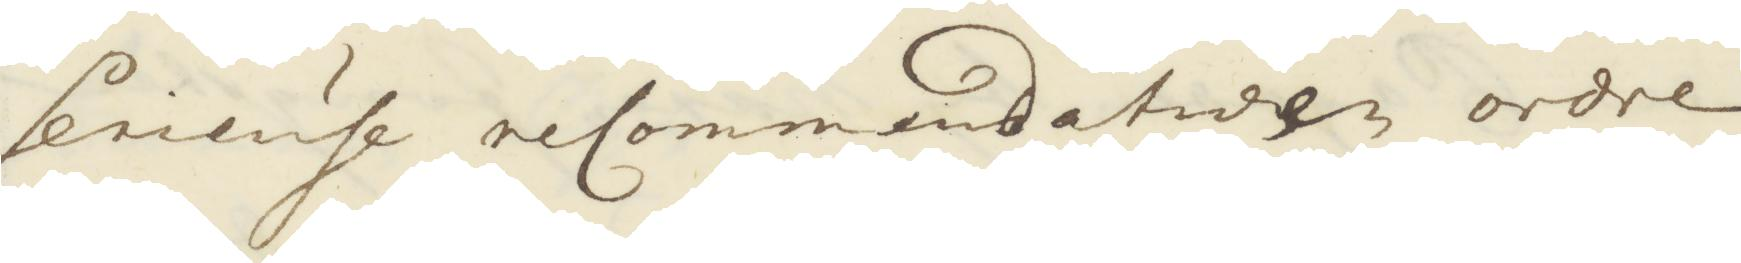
serieuse recommendativen ordre
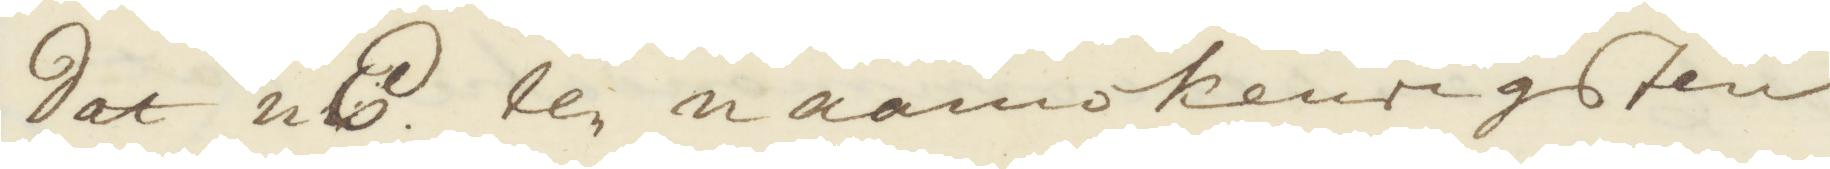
dat uE. ten naauwkeurigsten
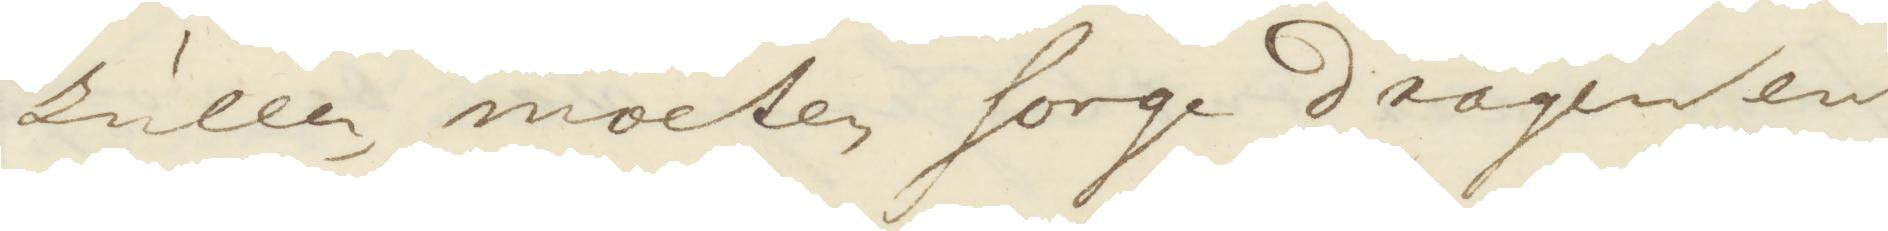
zullen, moeten sorge dragen en
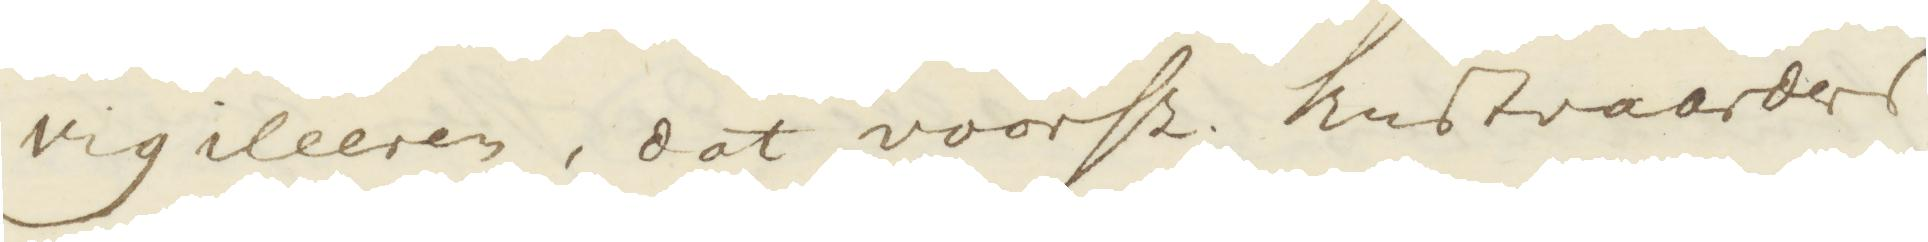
vigileeren, dat voorsz. kustvaarders
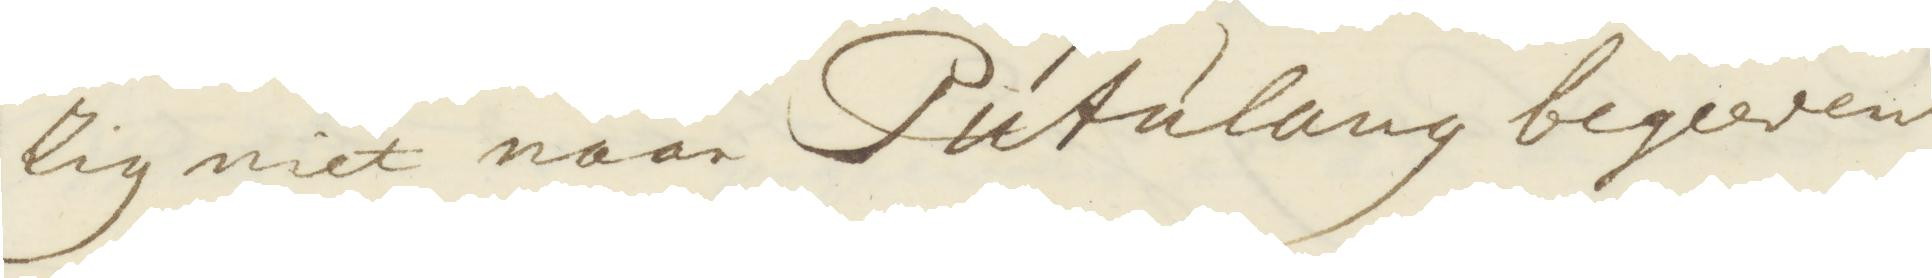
zig niet naar Putulang begeeven
